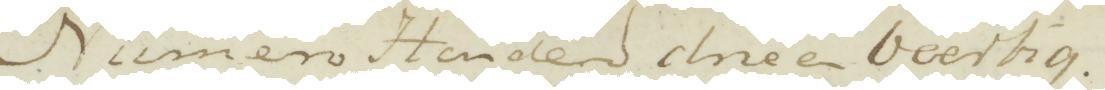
Numero Honderd drie en veertig.
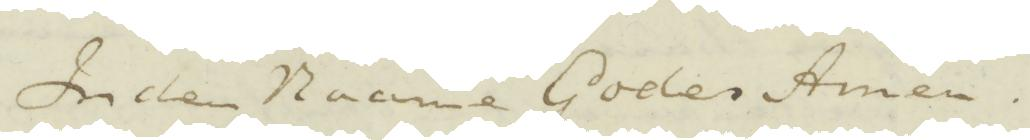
Jn den Naame Godes Amen!
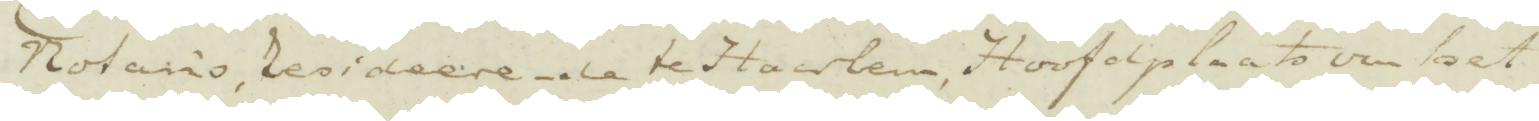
Notaris, resideerende te Haarlem, Hoofdplaats van het
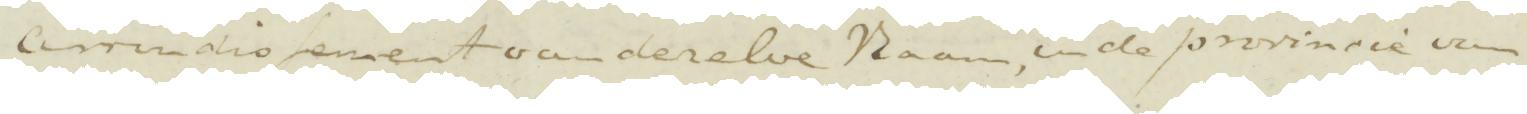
arrondissement van dezelve Naam, in de provincie van
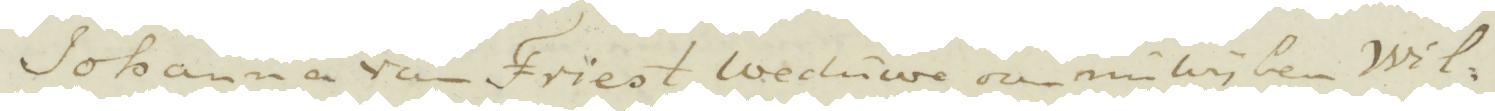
Johanna van Friest weduwe van nu wijlen Wil=
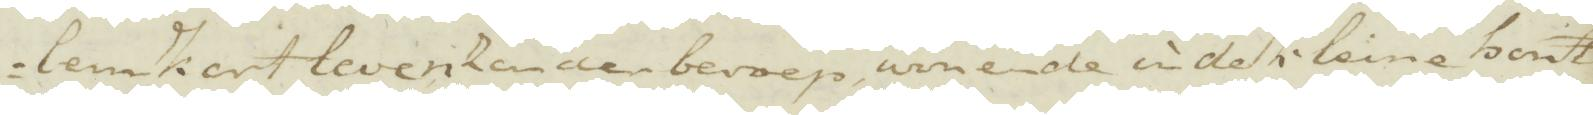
=lem Kortleven, zonder beroep, wonende in de kleine hout
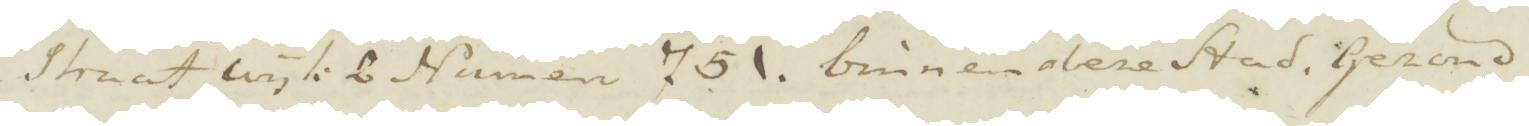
=straat wijk 2 Numeo 751. binnen deze stad, Gezond
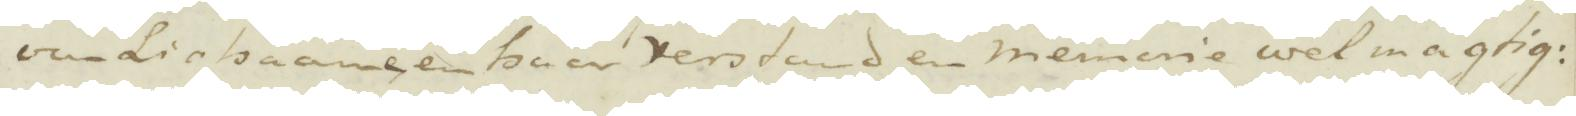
van Lichaame en haar verstand en memorie wel magtig:
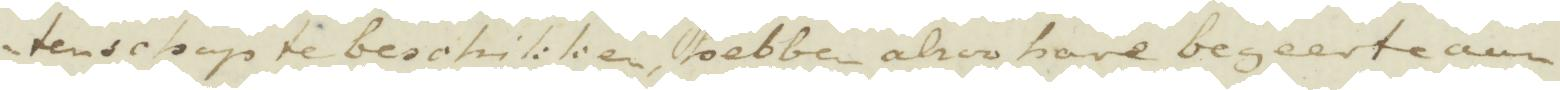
=tenschap te beschikken, hebben alzoo hare begeerte aan
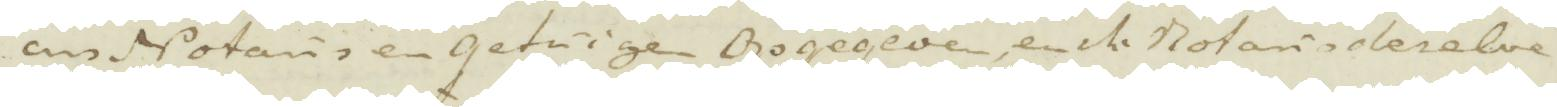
ons Notaris en getuigen opgegeven, en ik Notaris dezelve
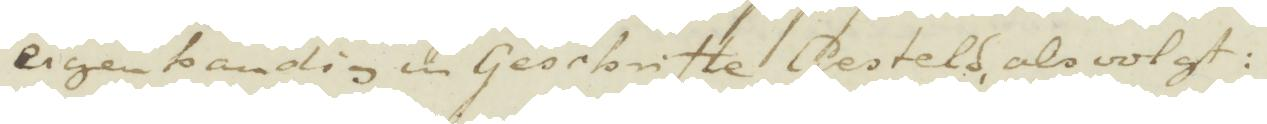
eigenhandig in Geschrifte Gesteld, als volgt:
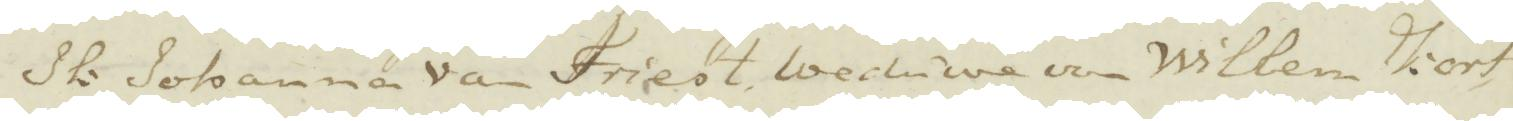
Jk Johanna van Friest, weduwe van Willem Kort
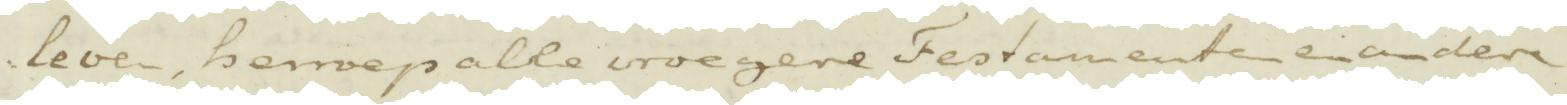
=leven, herroep alle vroegere Testamenten en andere
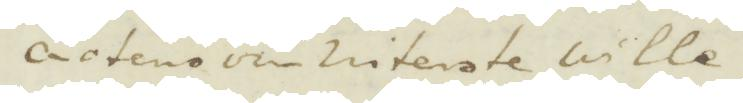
actens van uiterste wille
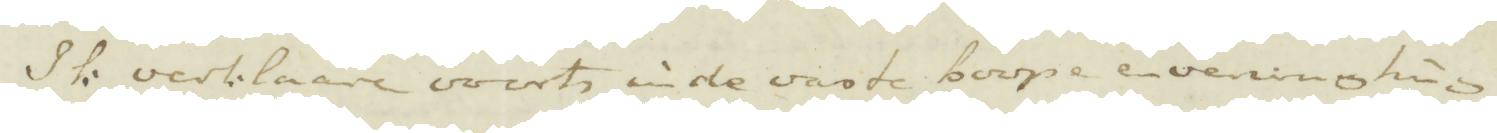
Jk verklaare voorts in de vaste hoope en verwagting
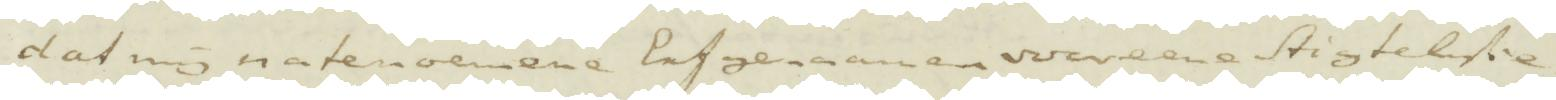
dat mij na te noemene Erfgenaamen voor eene stigtelyke
